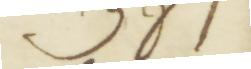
381
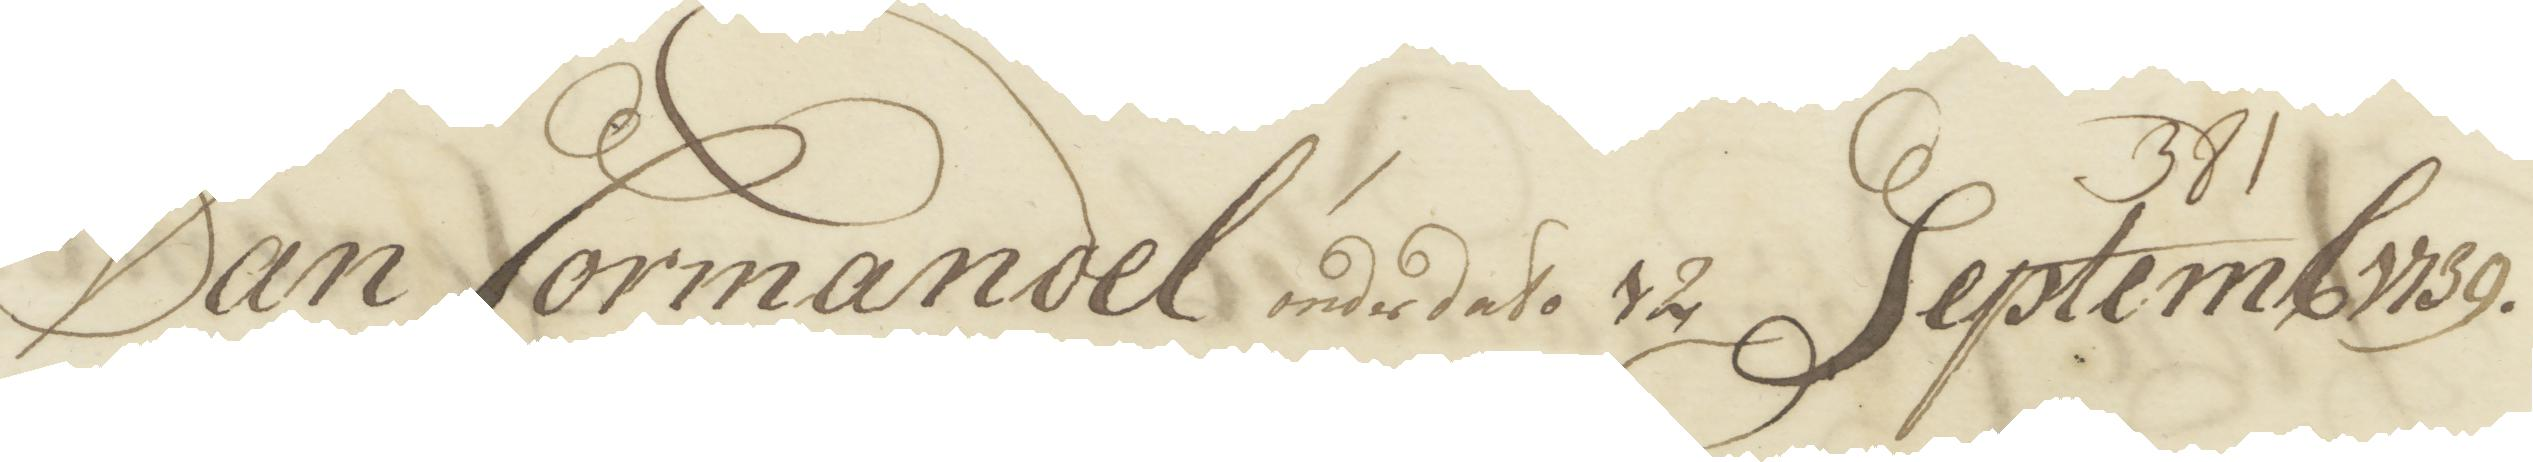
Van Cormandel onder dato 12 Septemb 1739.
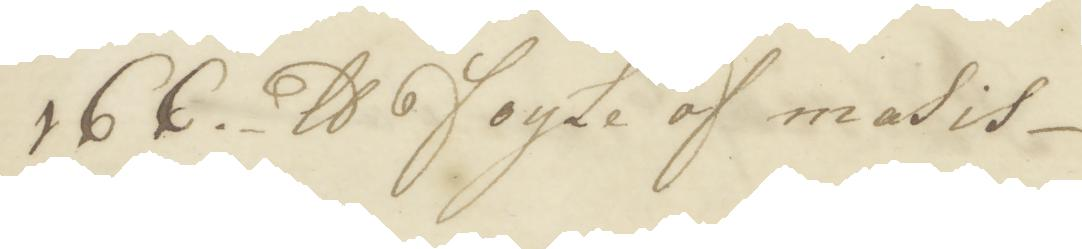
166. — lb foyle of masis -
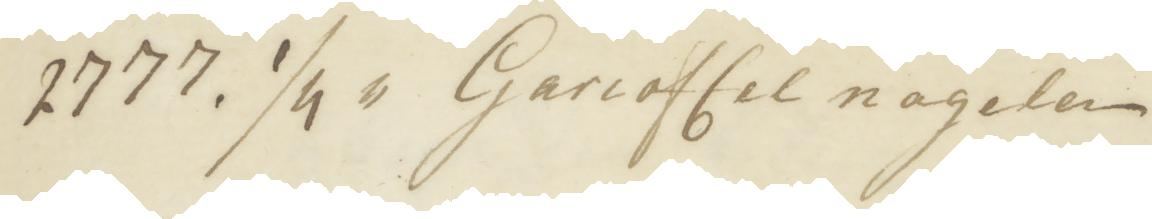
2777. ¼ „ Garioffel nagelen
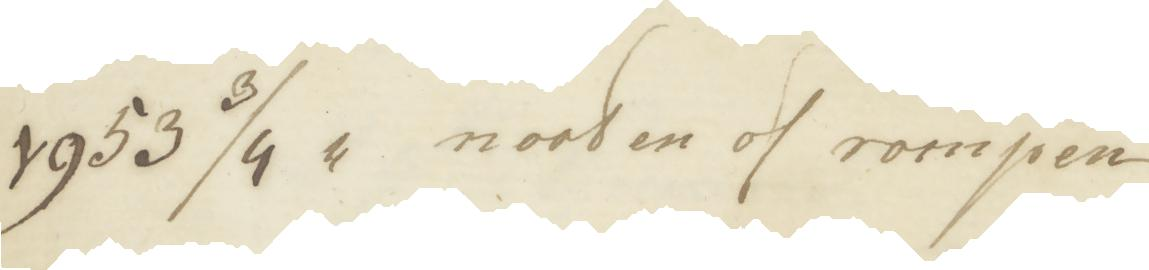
1953 3/4 „ nooten of rompen
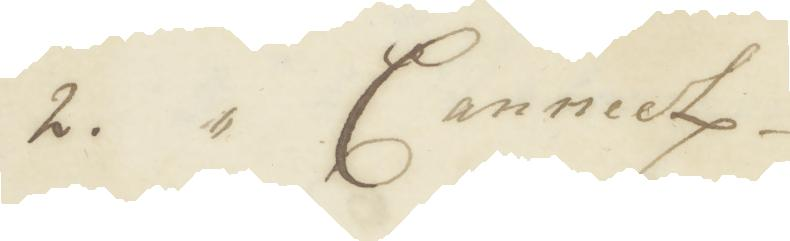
2. „ Canneel -
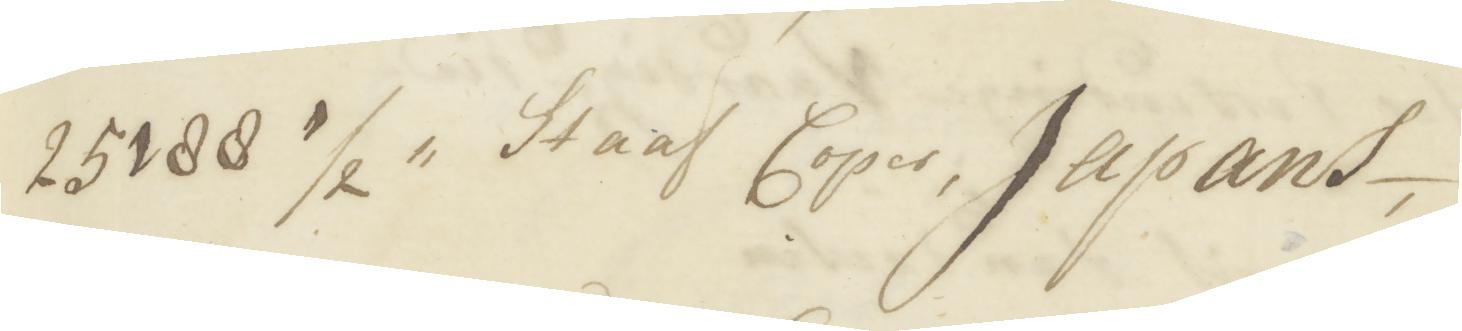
25188 ½ „ Staaf Coper, Japans —,
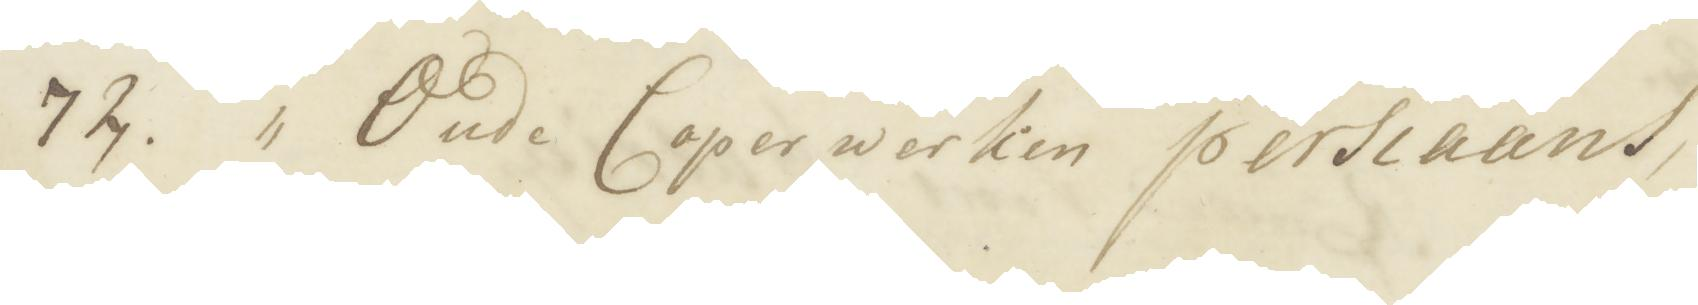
72. „ Oude Coper werken persiaans,
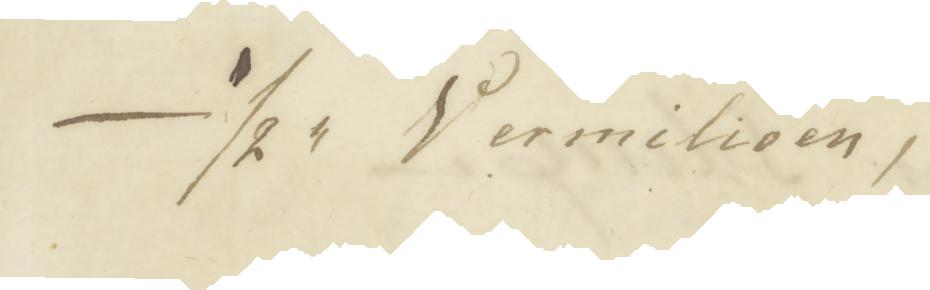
— ½ „ Vermilioen,
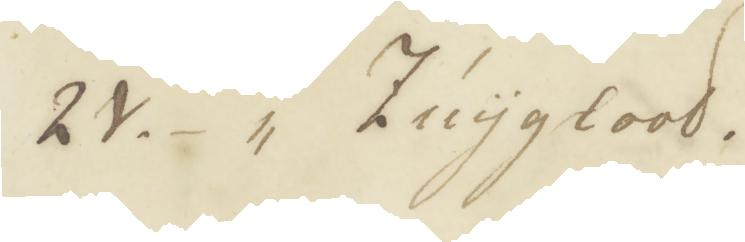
21. — „ Zuijglood,
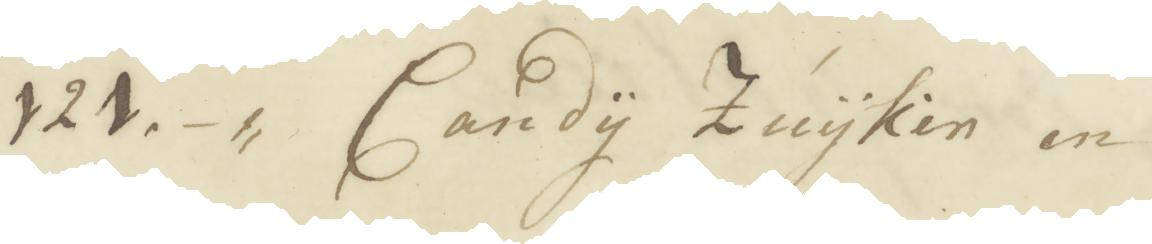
121. — „ Candij Zuijker en
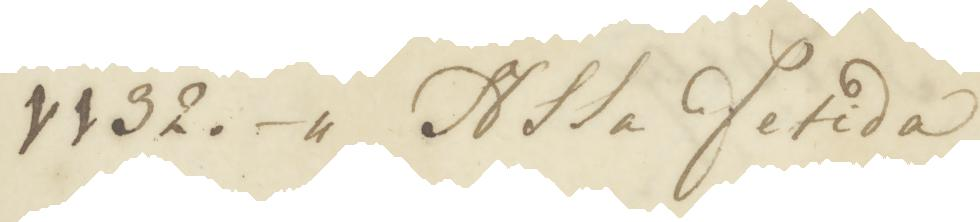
1132. — „ Assa fetida
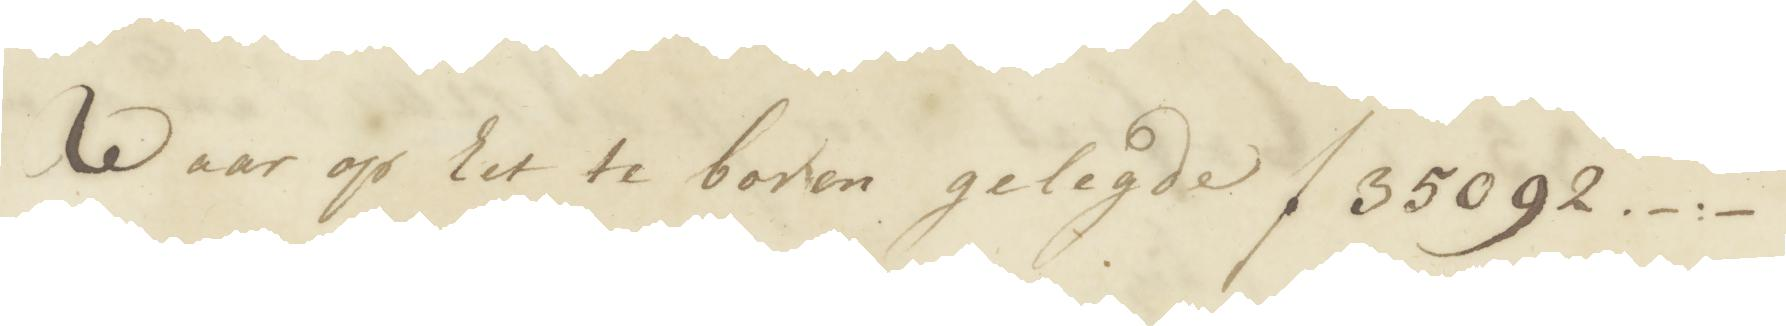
Waar op het te boven gelegde ƒ 35092. —: —
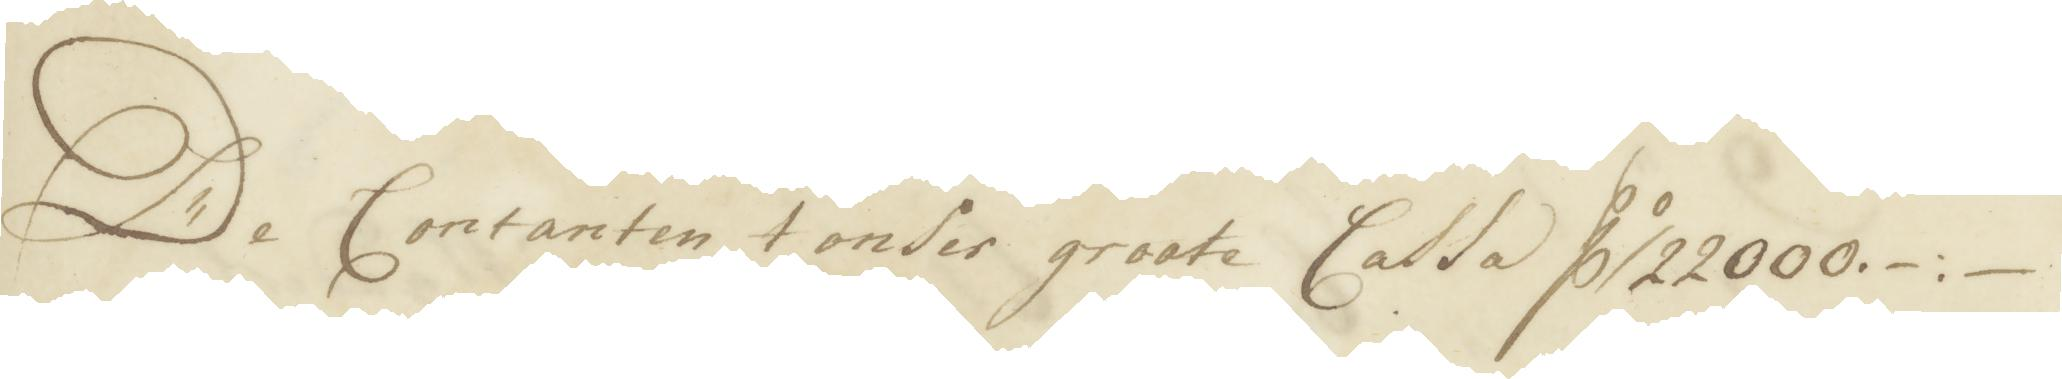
De Contanten 't onser groote Cassa p: po / 22000. —: —
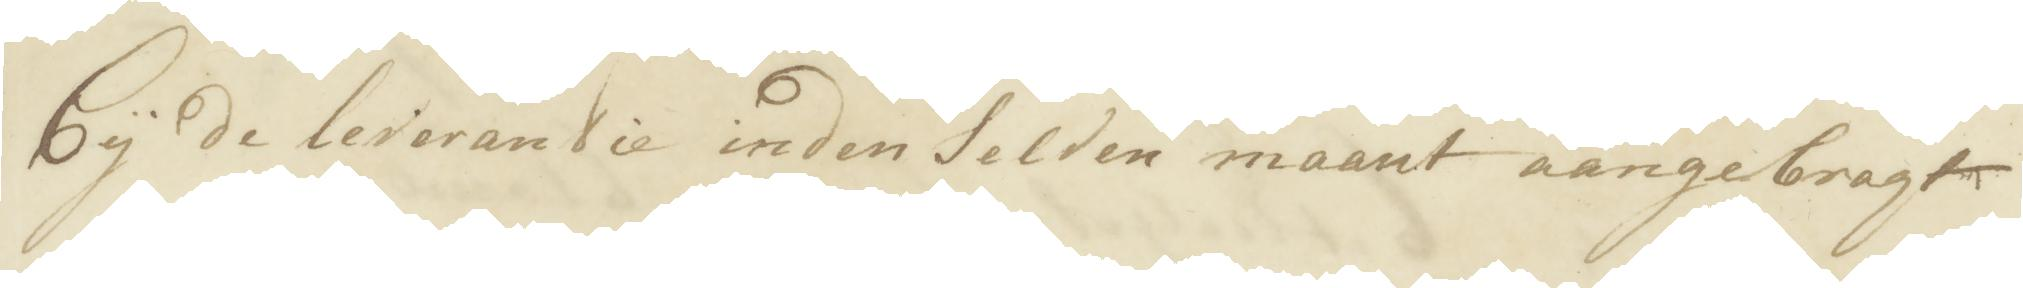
bij de leverantie inden Selven maant aangebragt
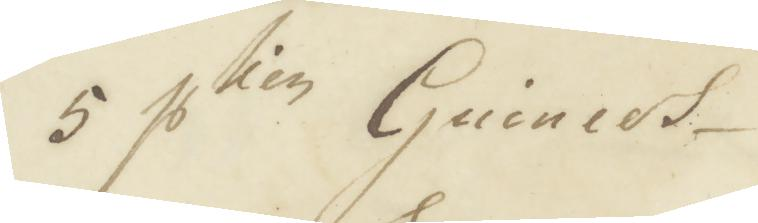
5 pken Guinees —
